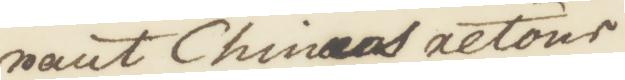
vant Chinaas retour
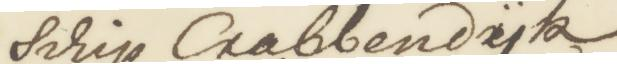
schip Crabbendijk
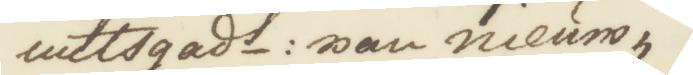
mitsgad-s: van nieuw„
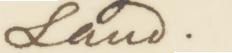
Land.
